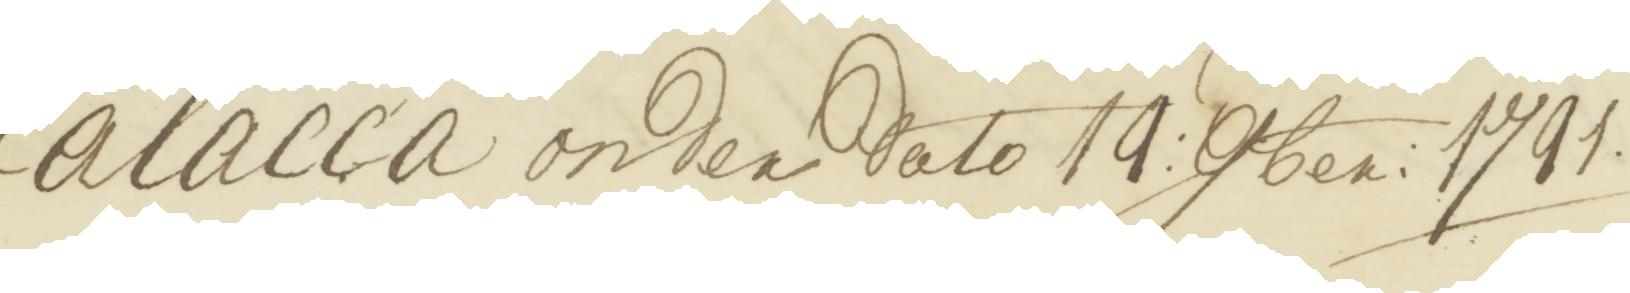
Malacca onder dato 14: 9ber: 1741.
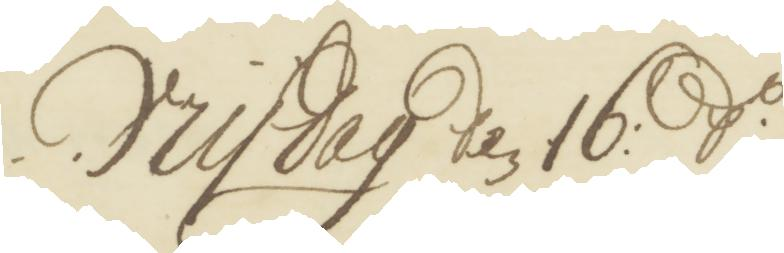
Vrijdag den 16:' d:o
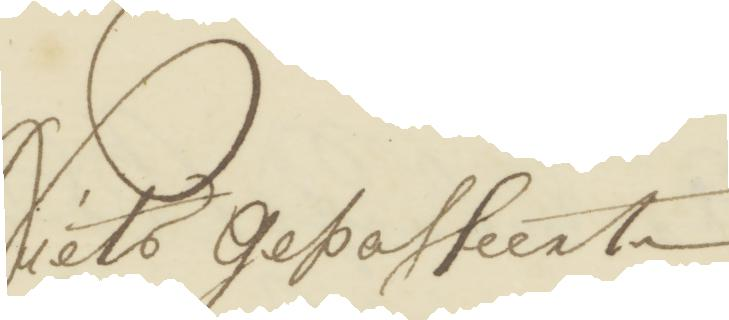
niets gepasseert
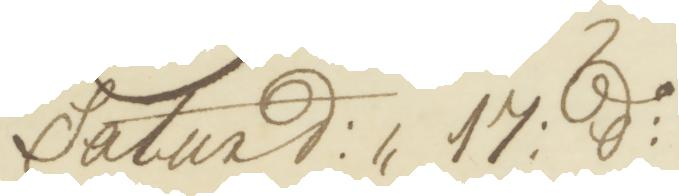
{Saturd: „ 17: d:o
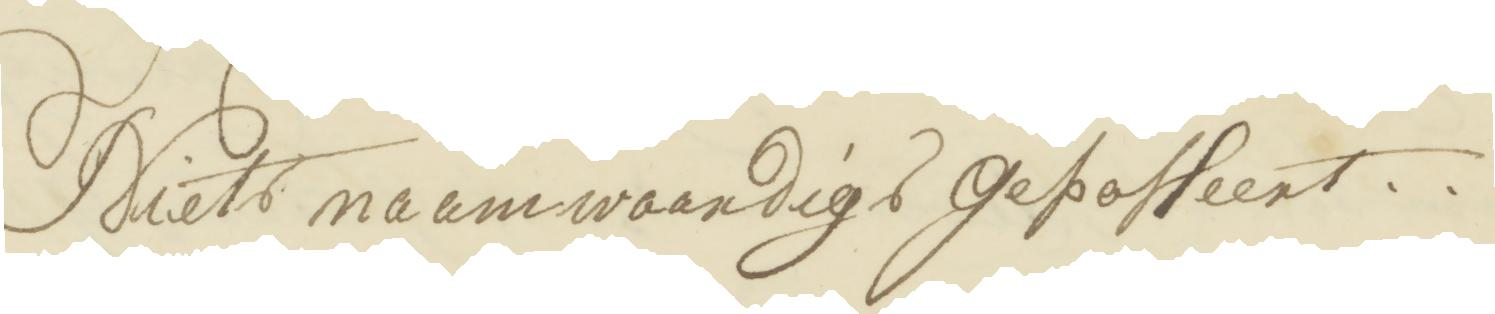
Niets naamwaardigs gepasseert..
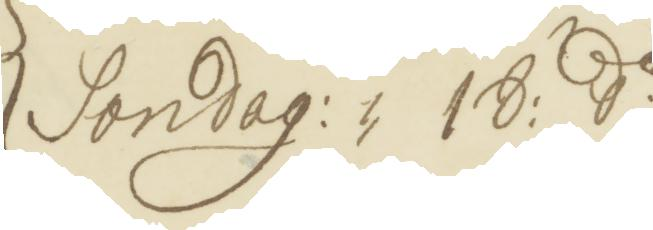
{Sondag: „ 18: d:o
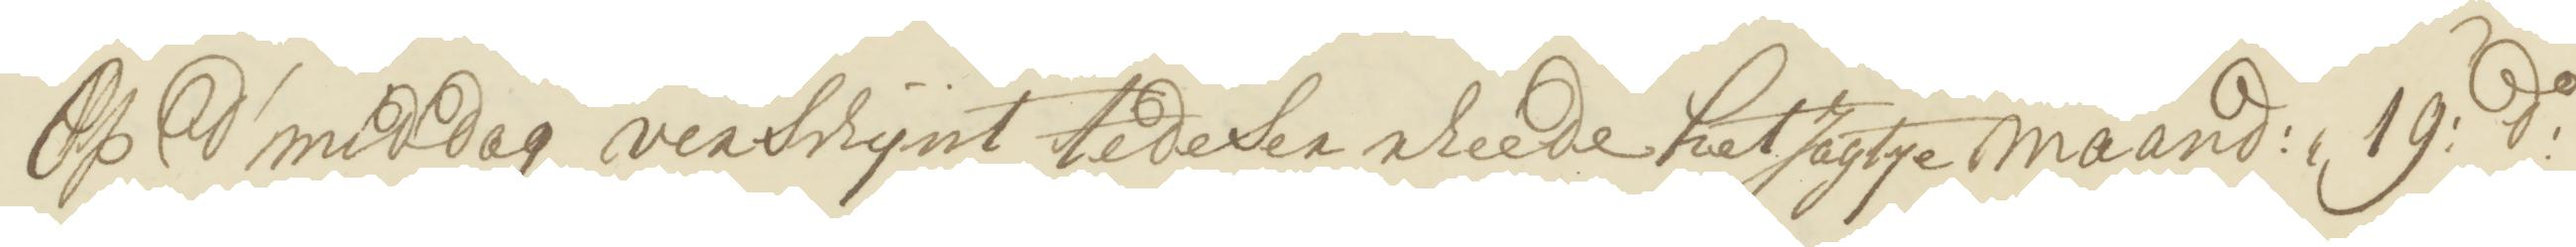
Op d’ middag verschijnt te deser rheede het Jagtje maand: „ 19: d:o
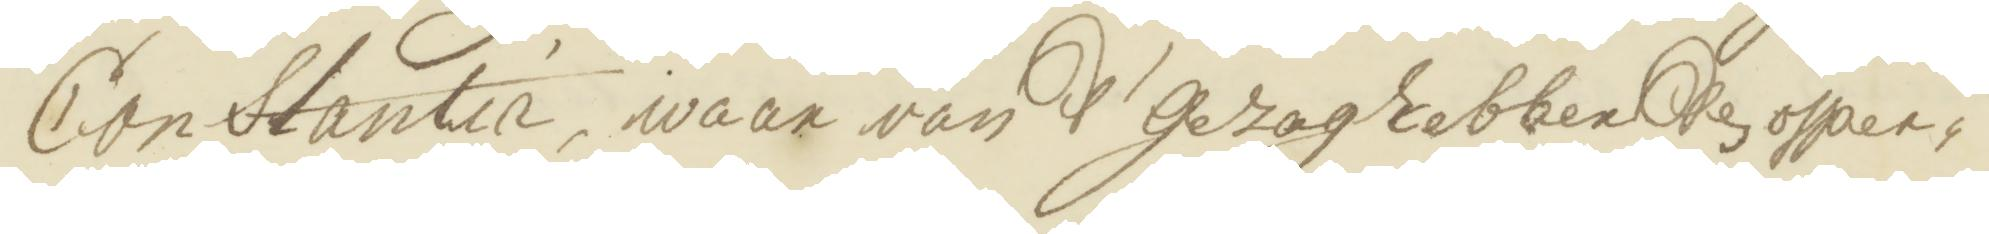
Constantia, waar van d’ gezaghebber den opper„
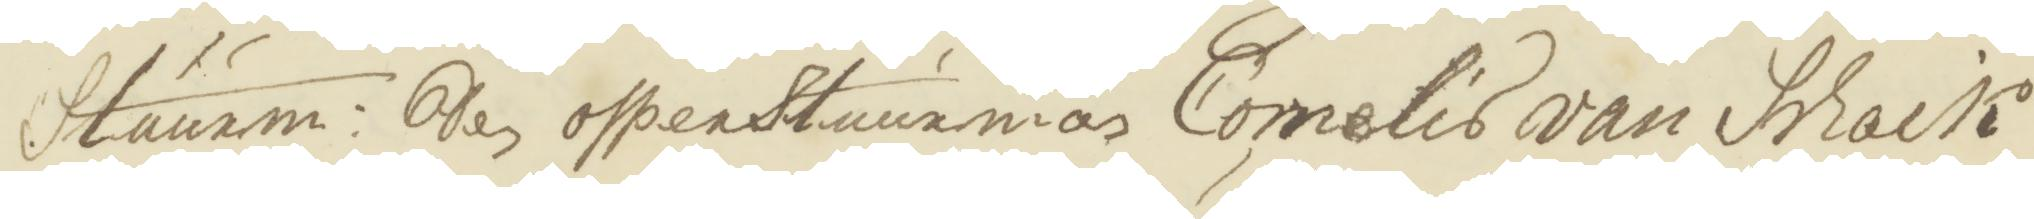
Stuurm: den opperstuurman Cornelis van Schaik
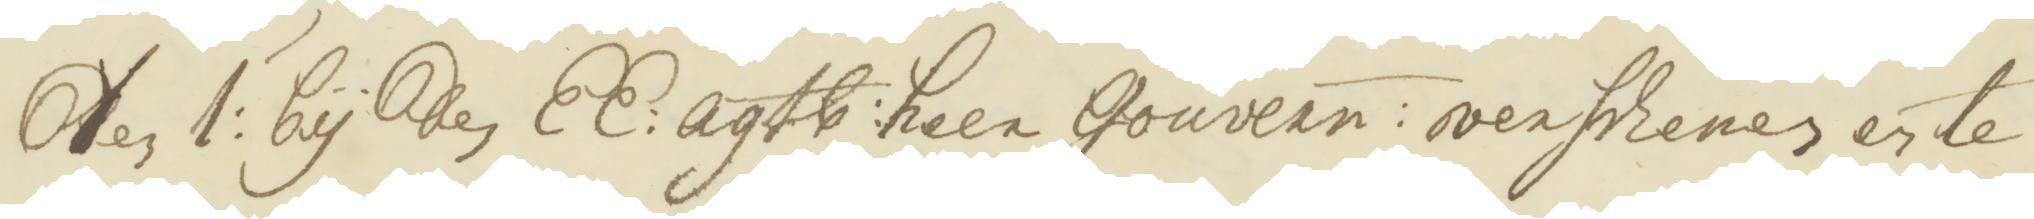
den 1: bij den E E: agtb: heer Gouvern: verschenen en te
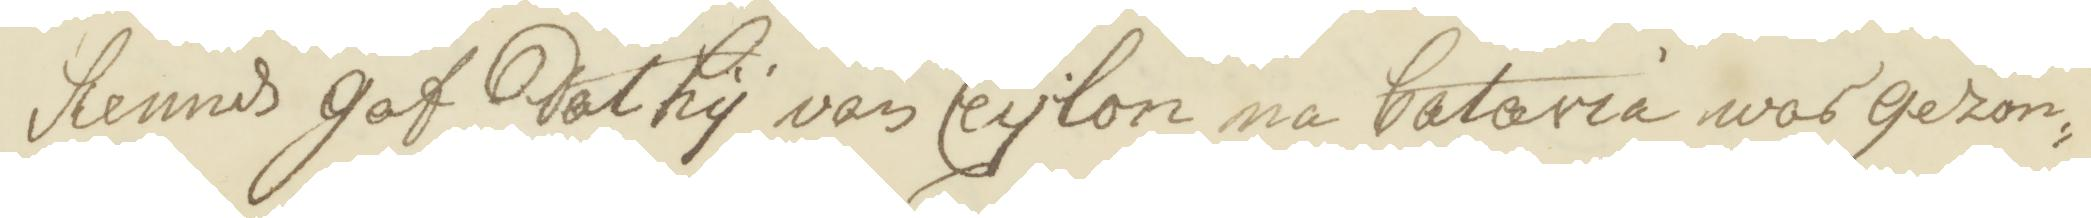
kennen gaf dat hij van Ceijlon na batavia was gezon„
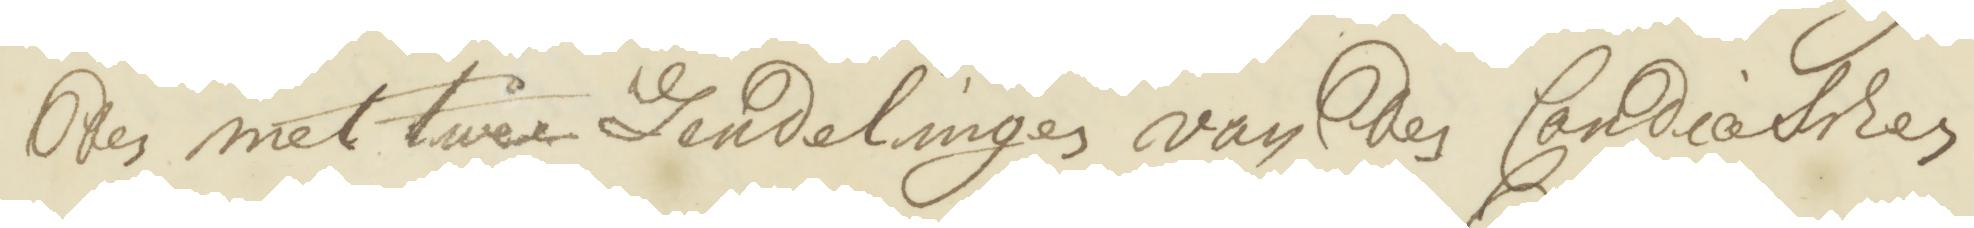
den met twee Zendelingen van den Candiaschen
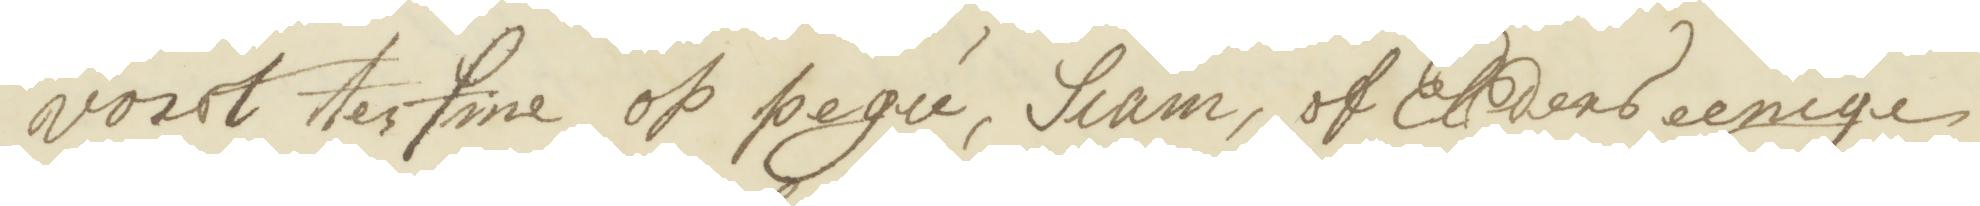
vorst ter fine op pegu, Siam, of Elders eenige
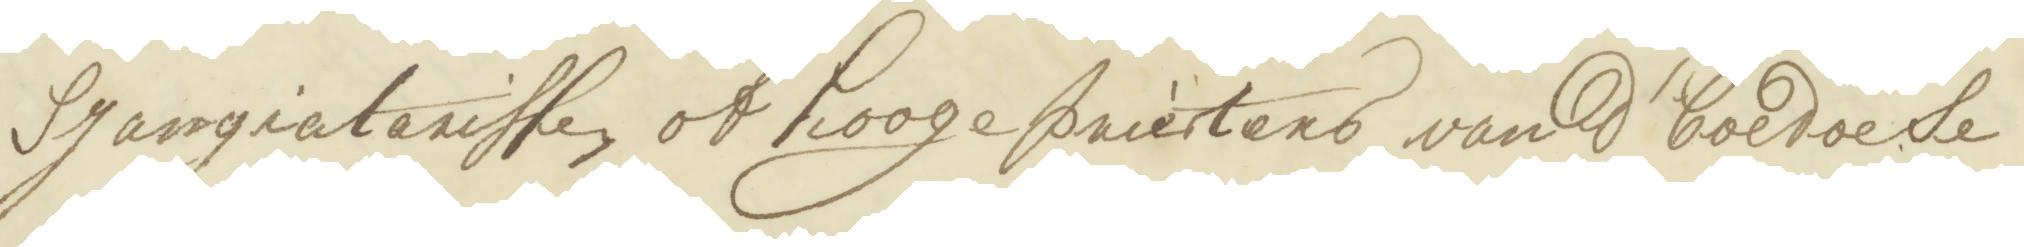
sjangiatarissen of hooge priesters van d’ boedoese
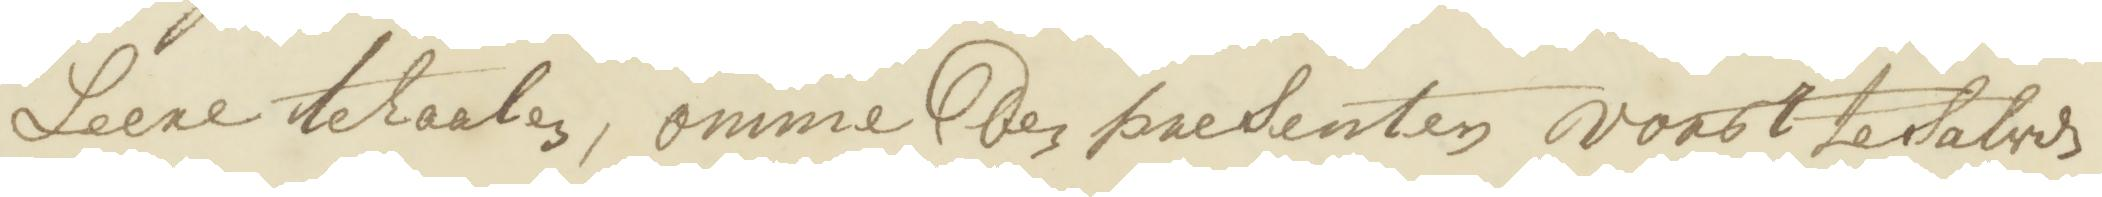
Leere te haalen, omme den presenten vorst te salven
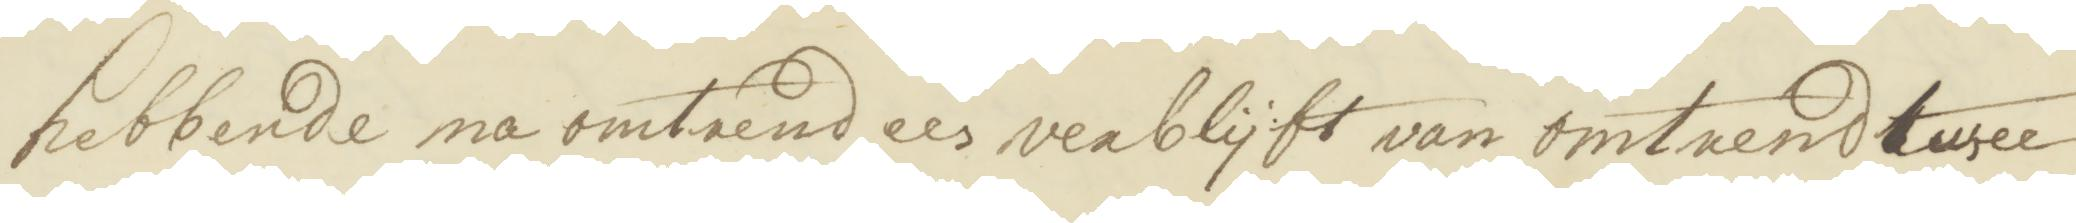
hebbende na omtrend een verblijft van omtrend twee
